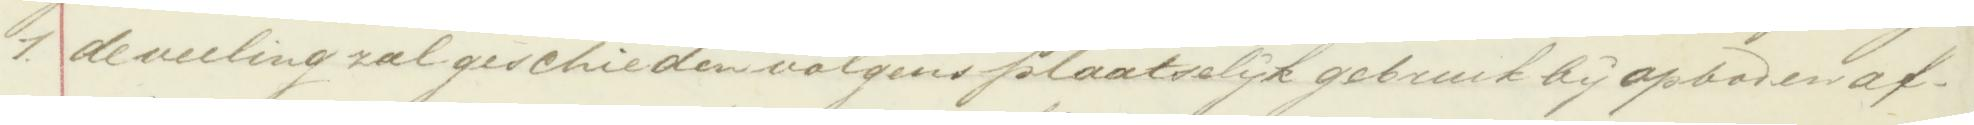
1. de veiling zal geschieden volgens plaatselijk gebruik bij opbod en af-
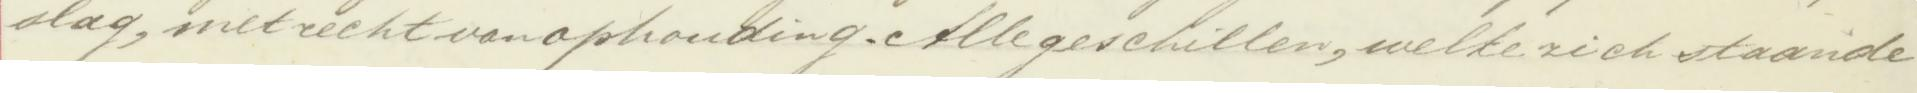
slag, met recht van ophouding- Alle geschillen, welke zich staande
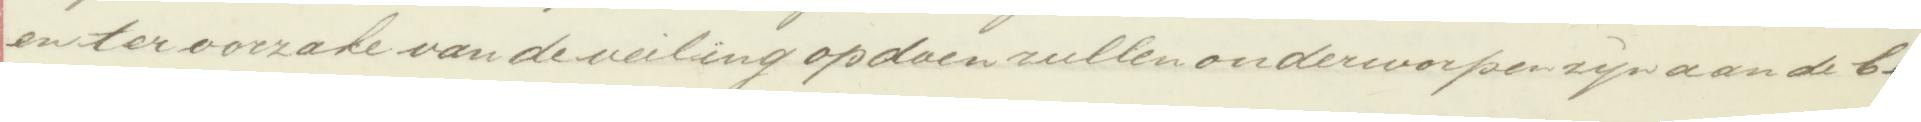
en ter oorzake van de veiling op doen zullen onderworpen zijn aan de be
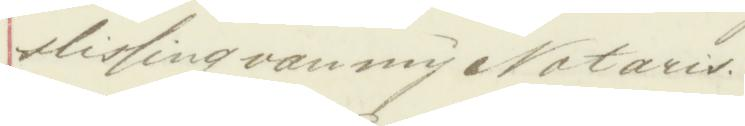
slissing van mij Notaris.
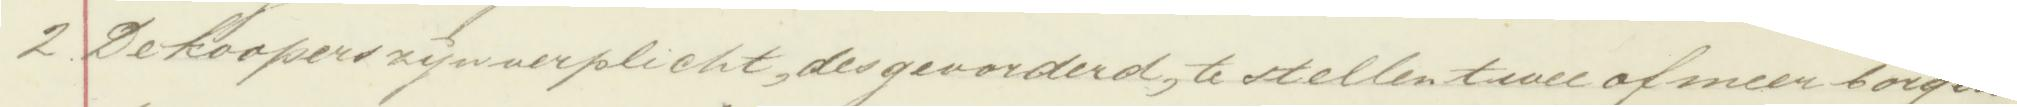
2. De koopers zijn verplicht, des gevorderd, te stellen twee of meer borgen
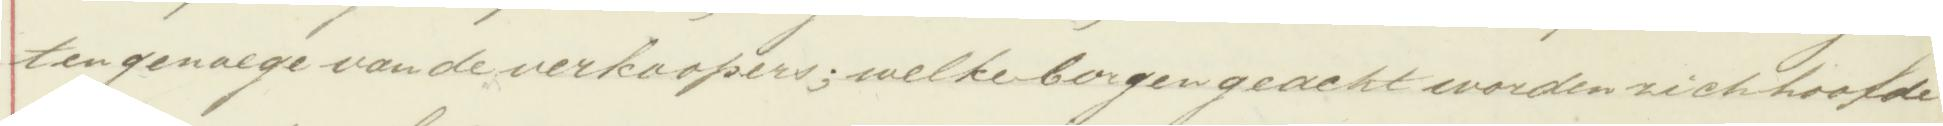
ten genoege van de verkoopers; welke borgen geacht worden zich hoofde
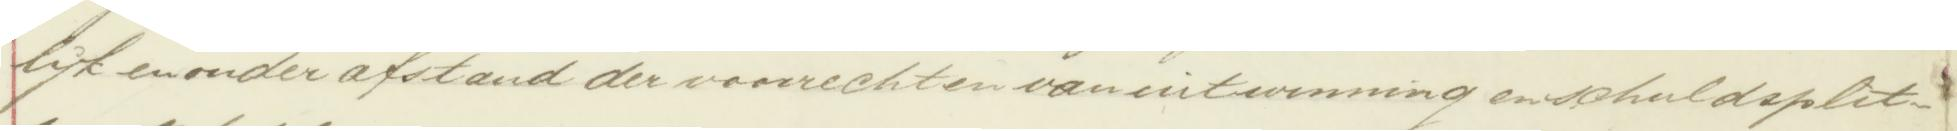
lijk en onder afstand der voorrechten van uitwinning en schuldsplit-
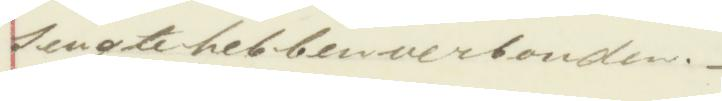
sing te hebben verbonden.
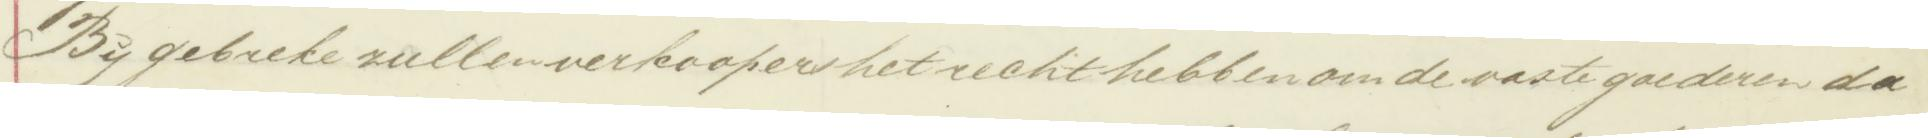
Bij gebreke zullen verkoopers het recht hebben om de vaste goederen da
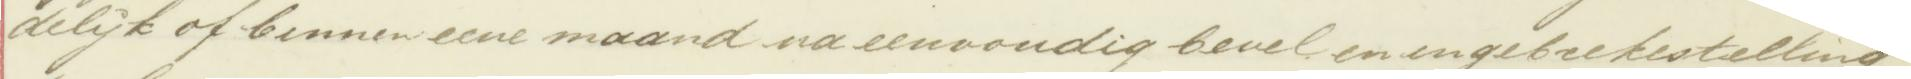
delijk of binnen eene maand na eenvoudig bevel en ingebrekestelling
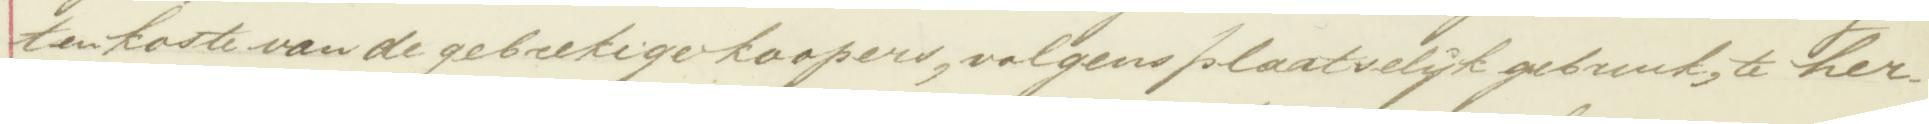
ten koste van de gebrekige koopers, volgens plaatselijk gebruik, te her-
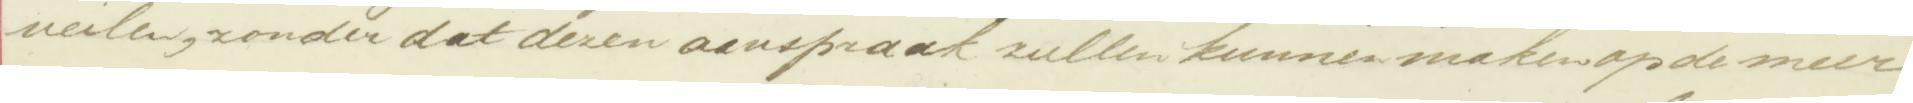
veilen, zonder dat dezen aanspraak zullen kunnen maken op de meer
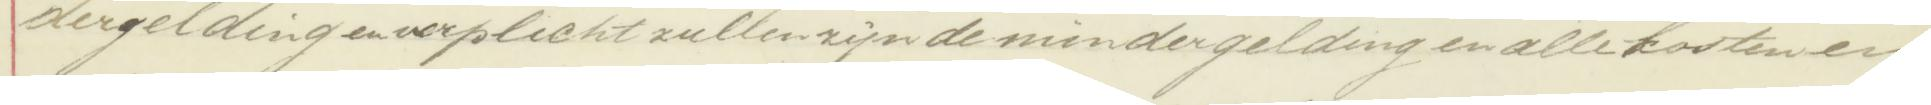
dergelding en verplicht zullen zijn de mindergelding en alle kosten en
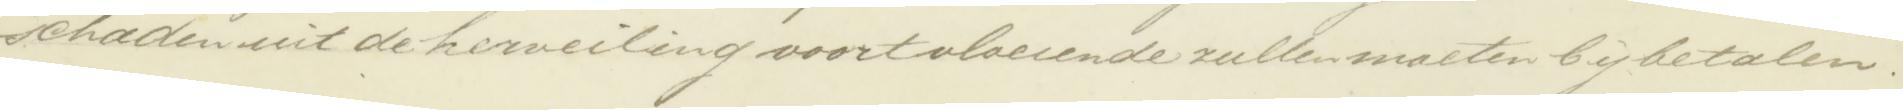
schaden uit de herveiling voortvloeiende zullen moeten bij betalen
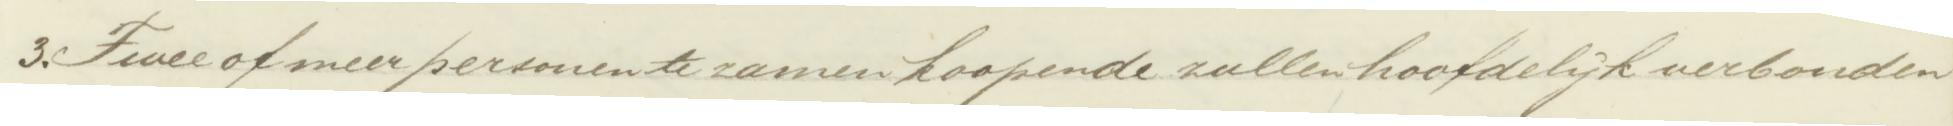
3: Twee of meer personen te zamen koopende zullen hoofdelijk verbonden
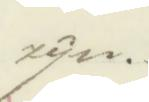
zijn.
